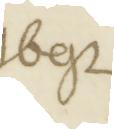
1692
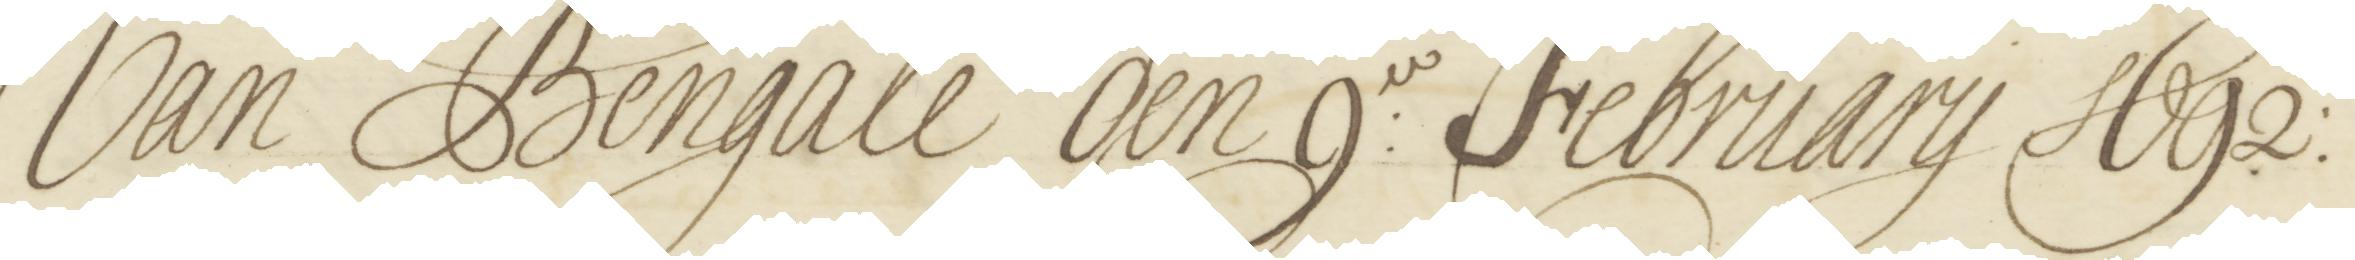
Van Bengale den 9:e Februarij 1692.
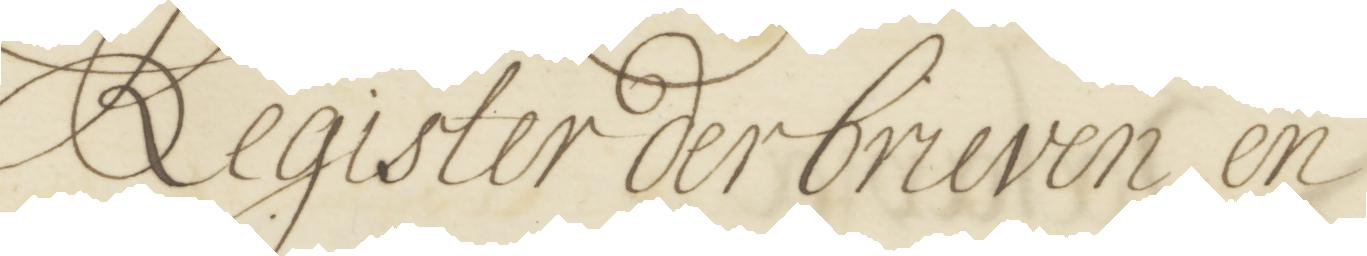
Register der brieven, en
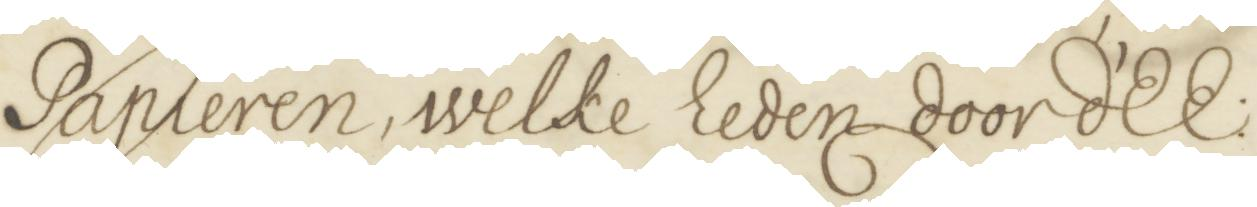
papieren, welke heden door d'EE:
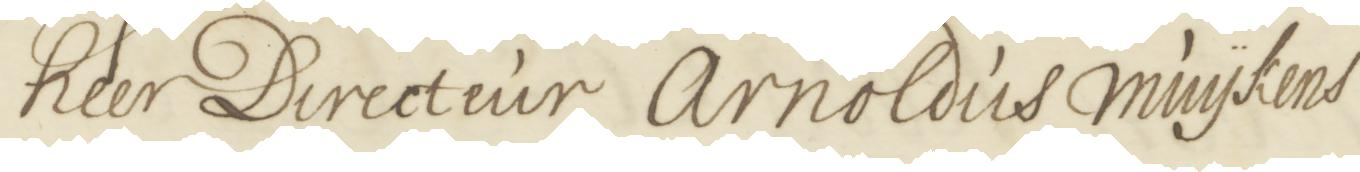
heer Directeur Arnoldus Muijkens
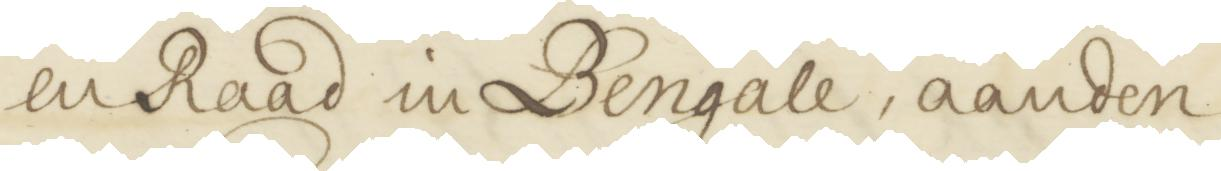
en Raad in Bengale, aanden
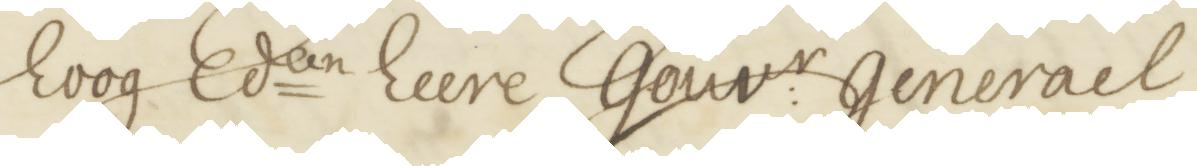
Hoog Ed=len heere Gouv:r generael
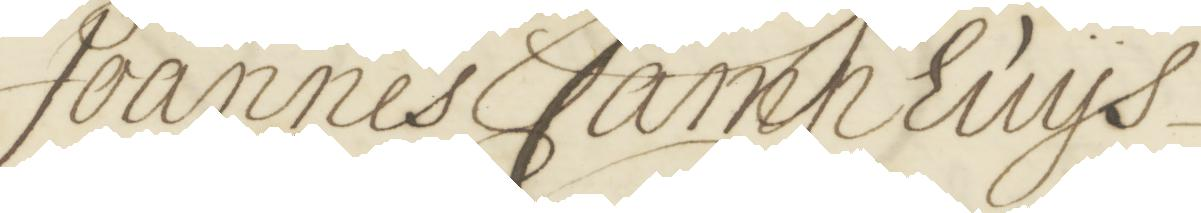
Joannes Camphuijs
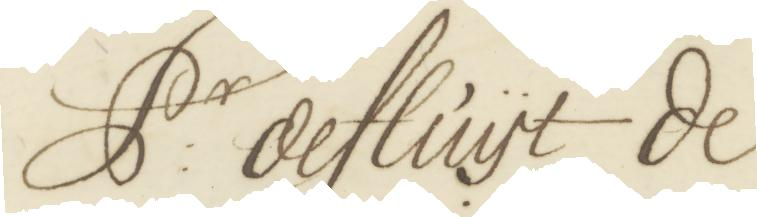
P:r defluijt de
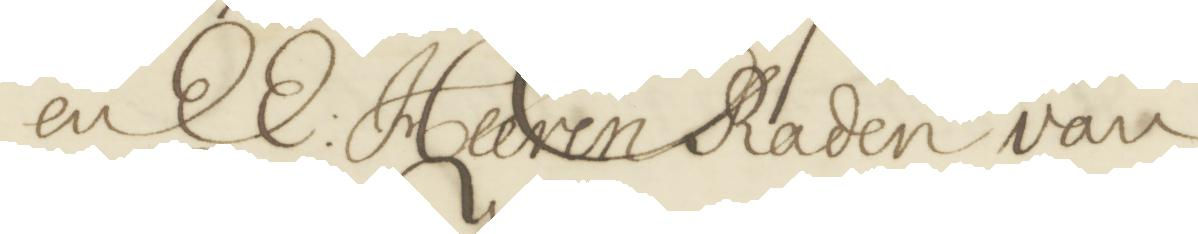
en EE: Heeren Raden van
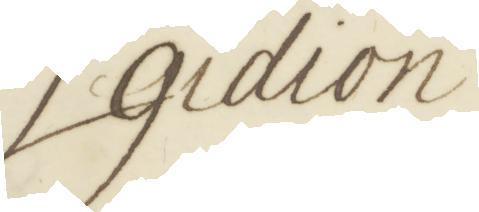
gidion
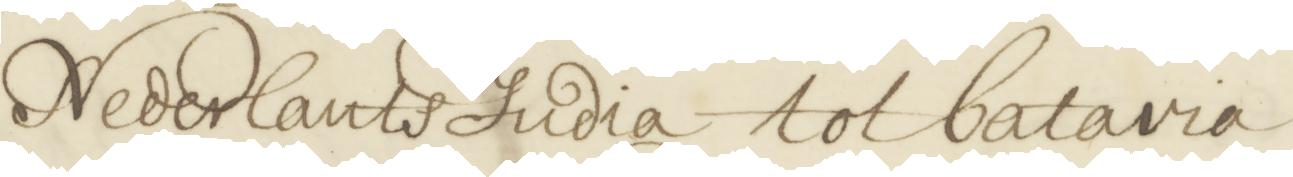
Nederlants India tot batavia
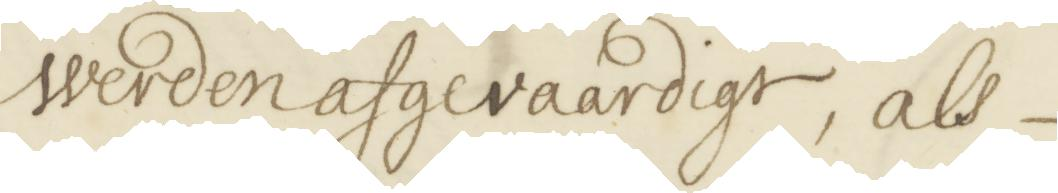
werden afgevaardigt, als
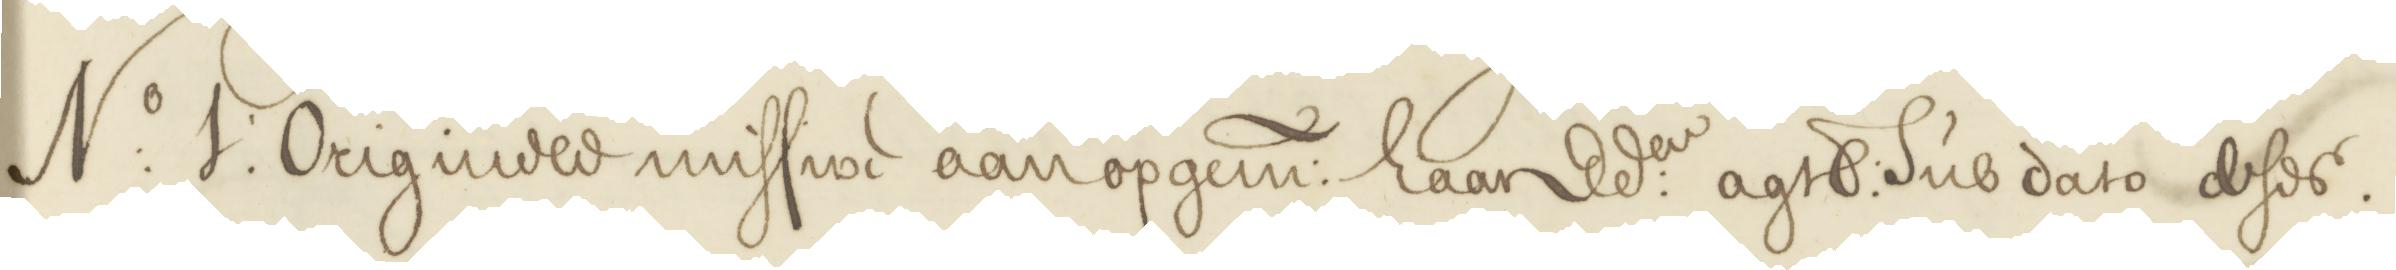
N:o 1. Originele missive aan op gem: haar Ed=le agtb:Sub dato deses.
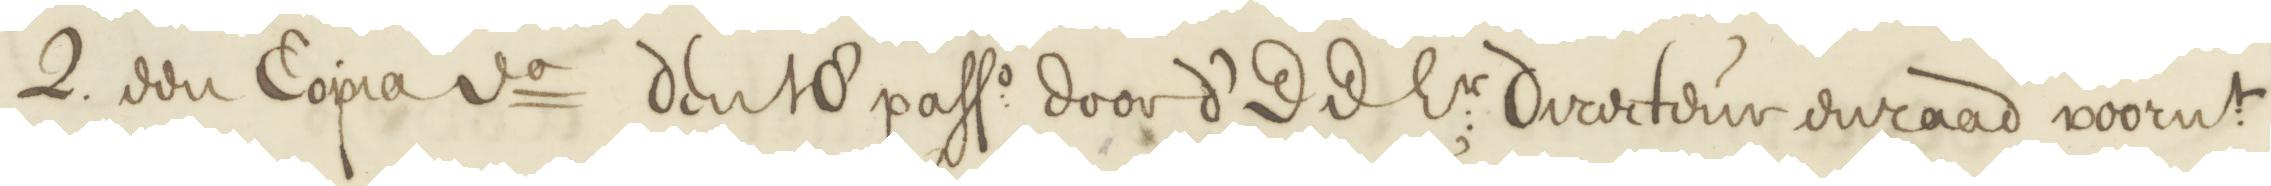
2. een Copia d=o den 18 pass:o door d’ E E h:r directeur enraad voorn:t
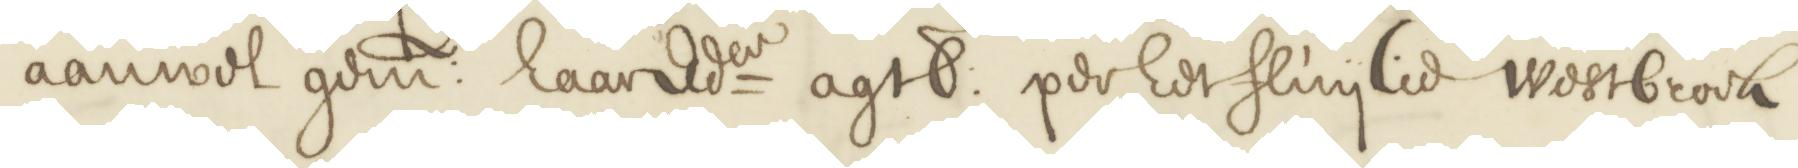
aanwel gem: haarEd=le agtb: per het fluijtie westbroek
